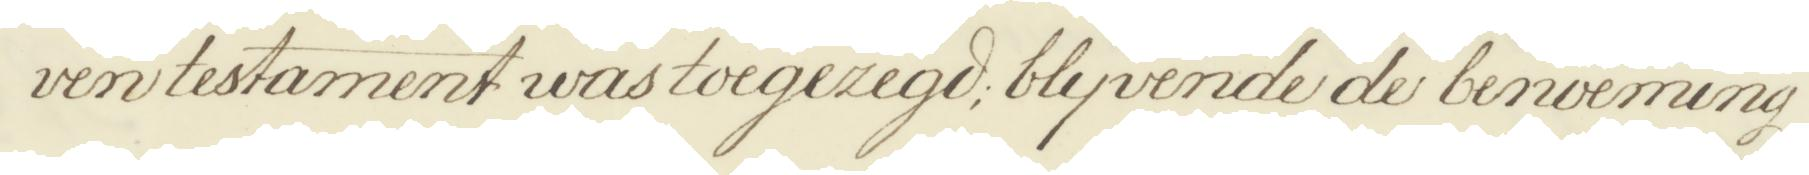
ven testament was toegezegd; blyvende de benoeming
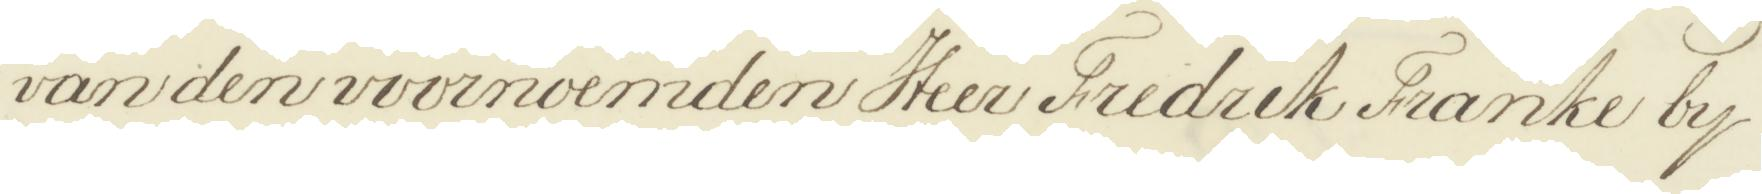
van den voornoemden Heer Fredrik Franke by
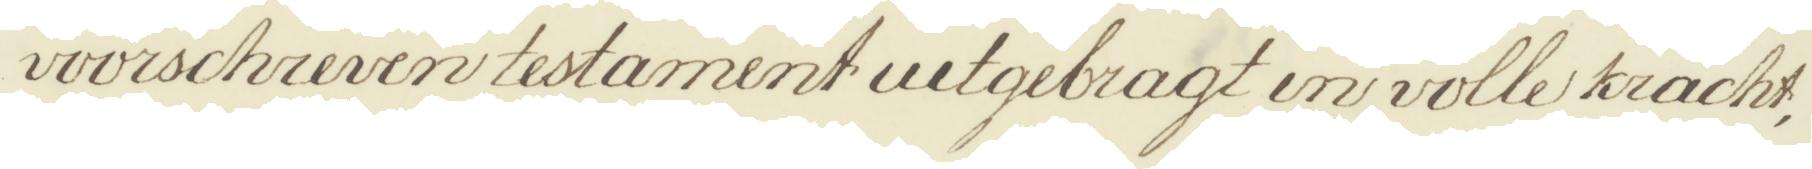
voorschreven testament uitgebragt in volle kracht,
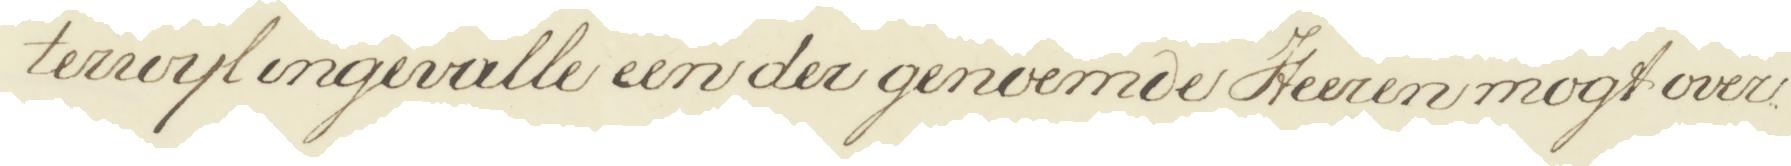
terwyl ingevalle een der genoemde Heeren mogt over„
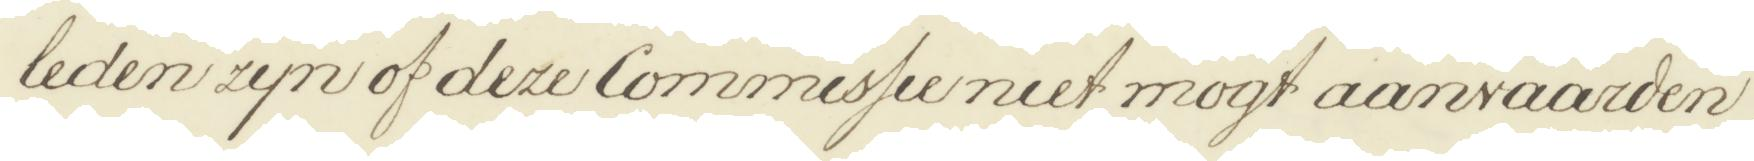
leden zyn of deze commissie niet mogt aanvaarden
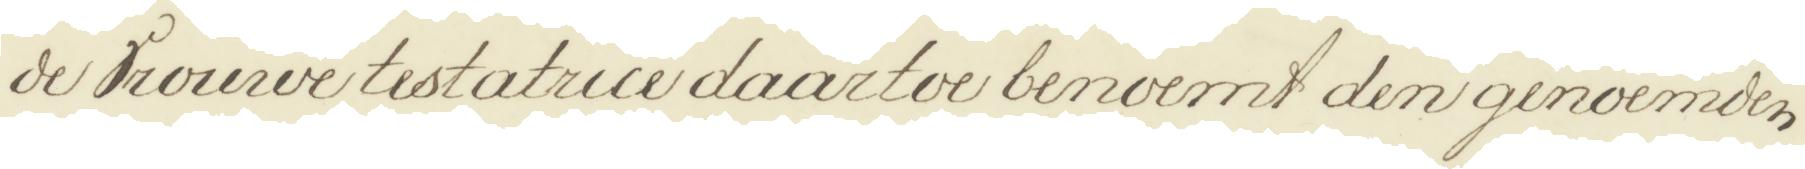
de Vrouwe testatrice daar toe benoemt den genoemden
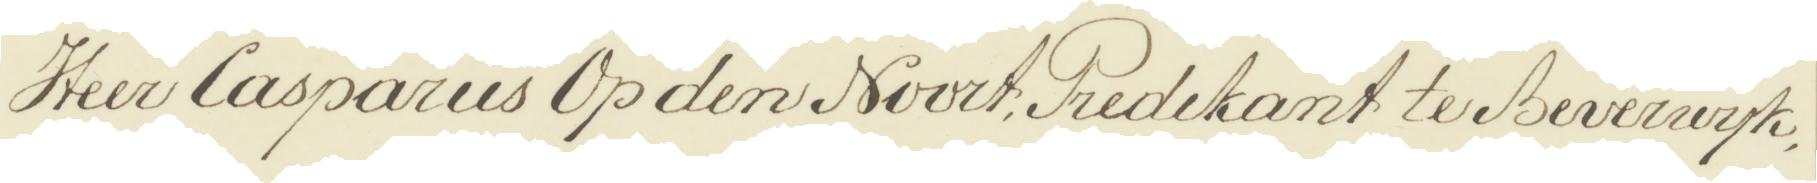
Heer Casparus Op den Noort, Predikant te Beverwyk,
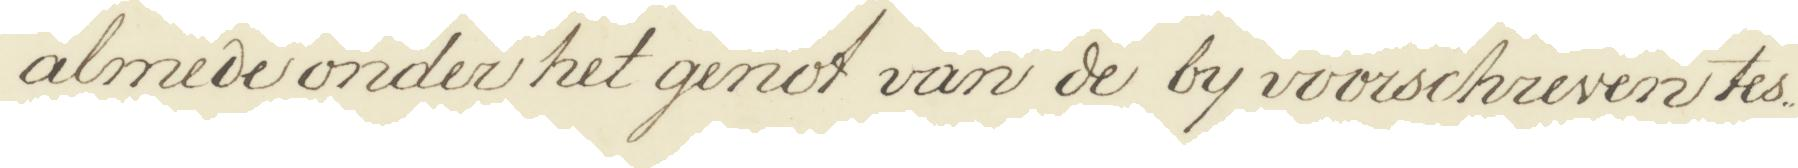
almede onder het genot van de by voorschreven tes„
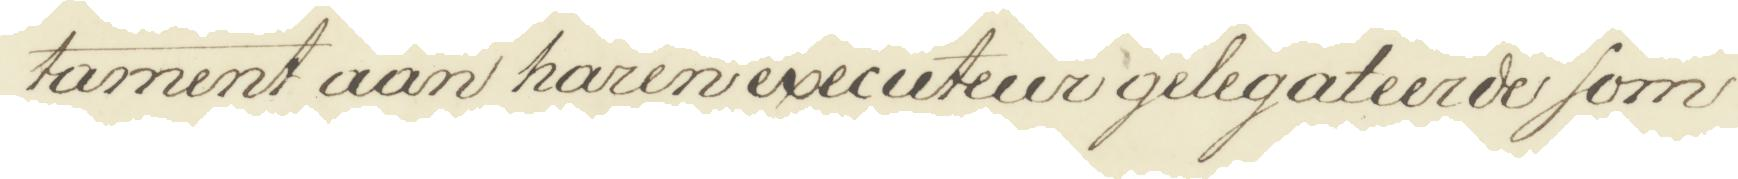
tament aan haren executeur gelegateerde Som
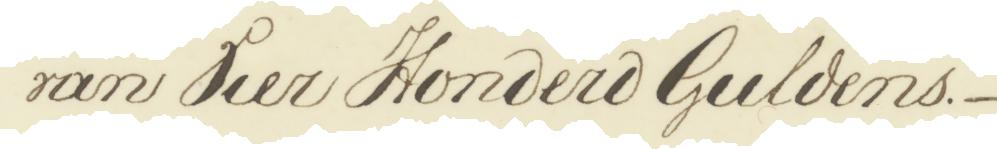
van Vier Honderd Guldens.-
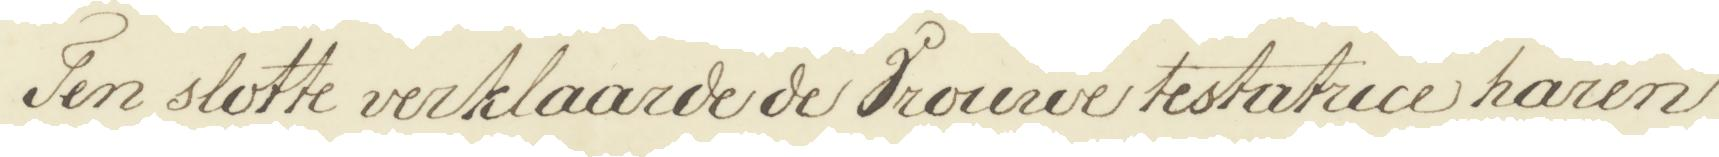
Ten slotte verklaarde de Vrouwe testatrice haren
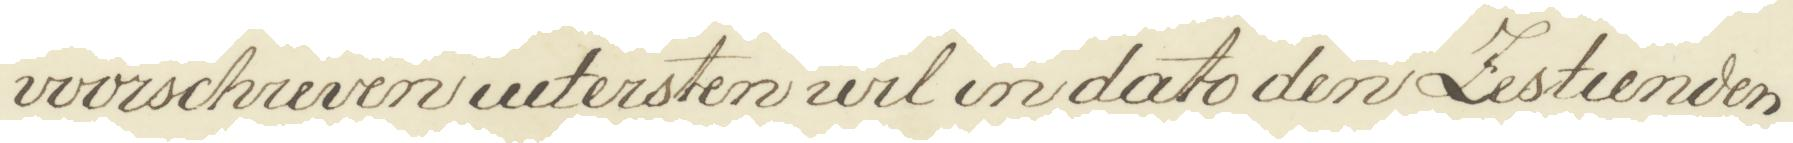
voorschreven uitersten wil in dato den Zestienden
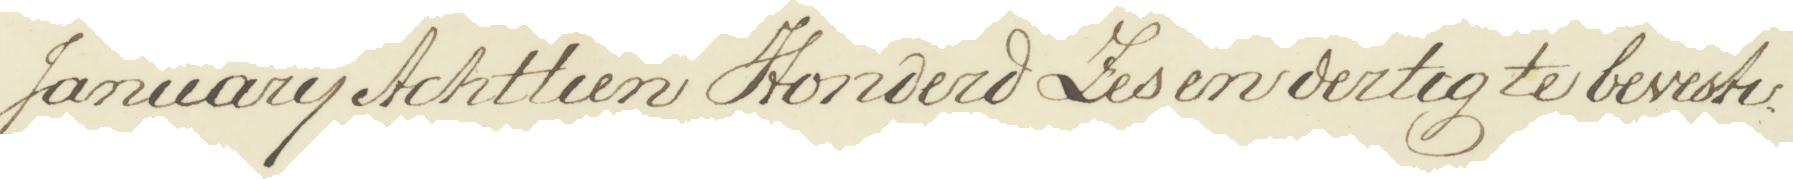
January Achttien Honderd zes en dertig te bevesti„
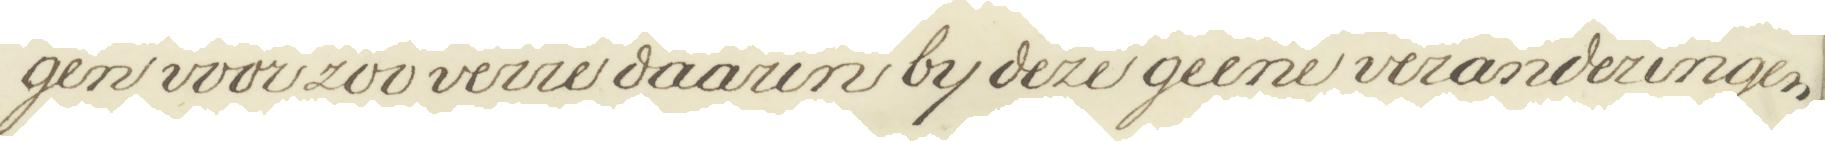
gen voor zooverre daaren by deze geene veranderingen
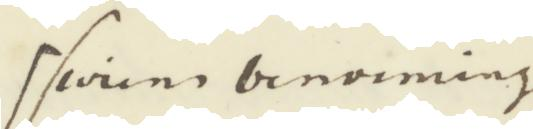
(wiens benoeming
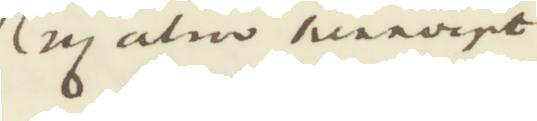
zy alzoo herroept
